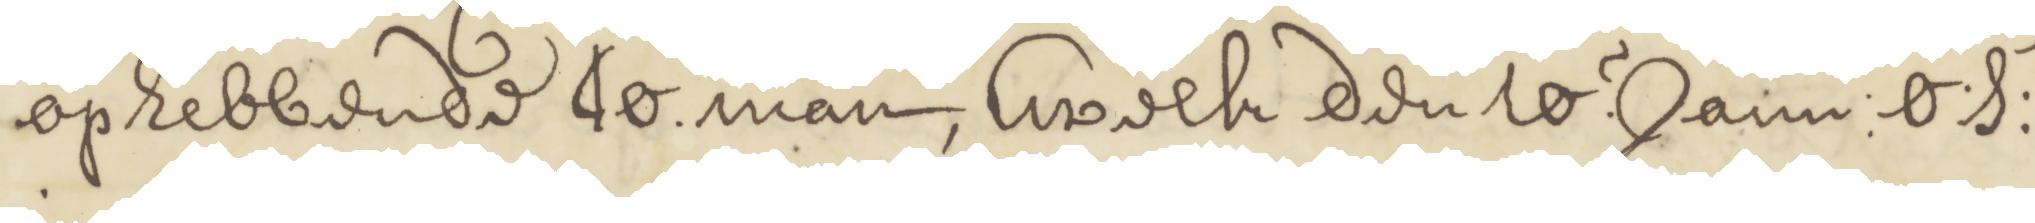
op hebbende 40. man, 'twelk den 10.' Jann: o: s
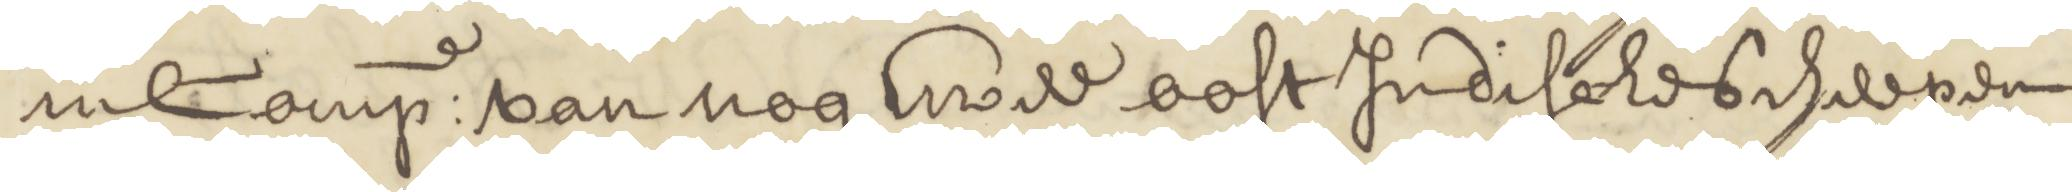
in Comp:e van nog twee oost Jndische scheepen
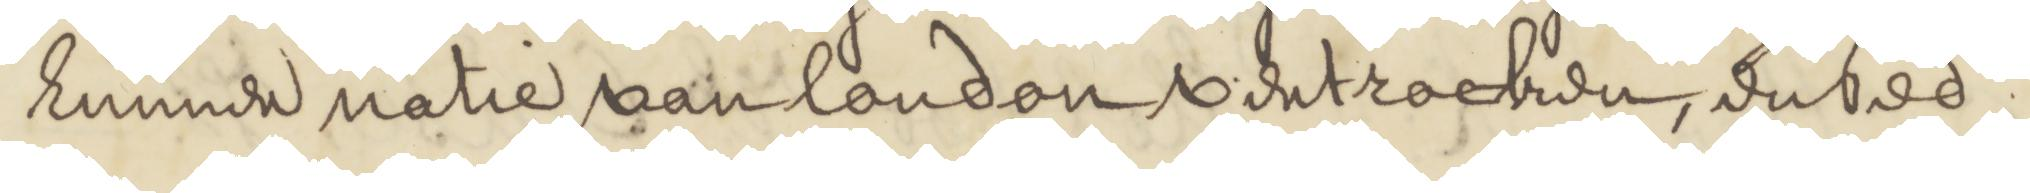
hunner natie van london vertrocken, en sedt
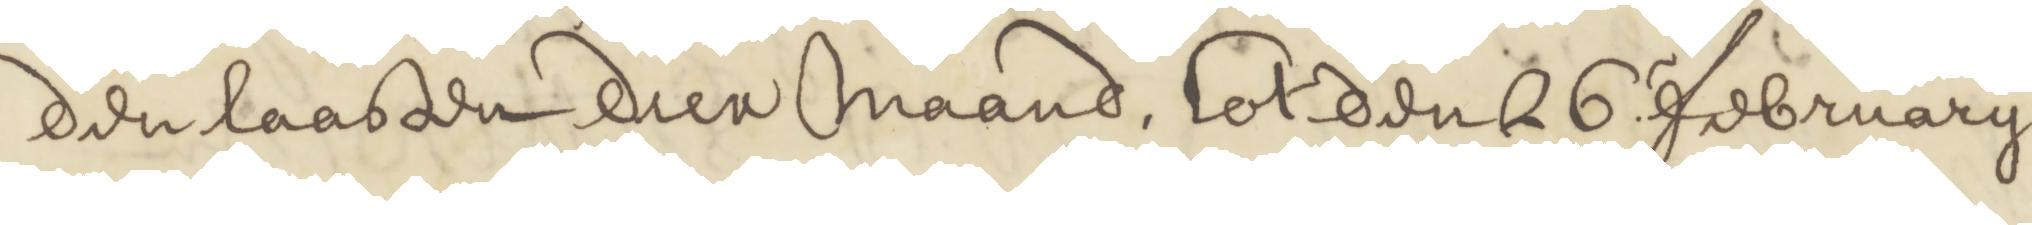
den laasten dier maand, tot den 26.' february
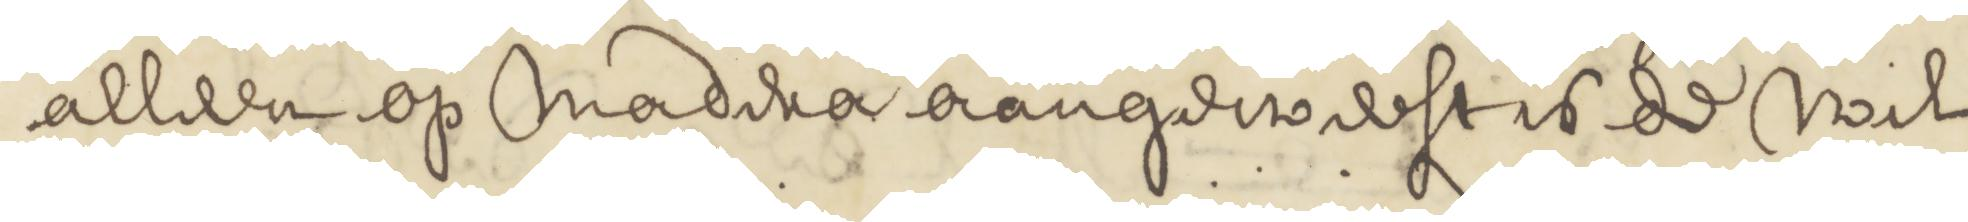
alleen op madera aangeweest is de wil
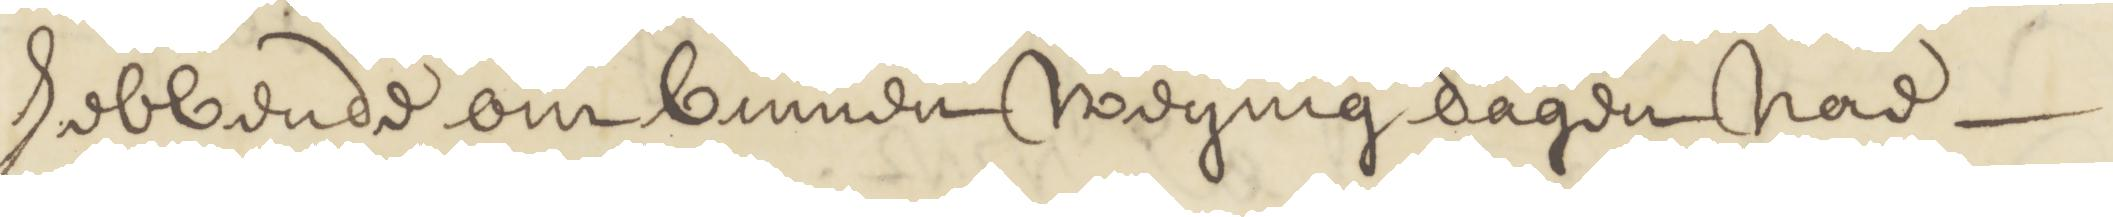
hebbende om binnen weijnig dagen nae —
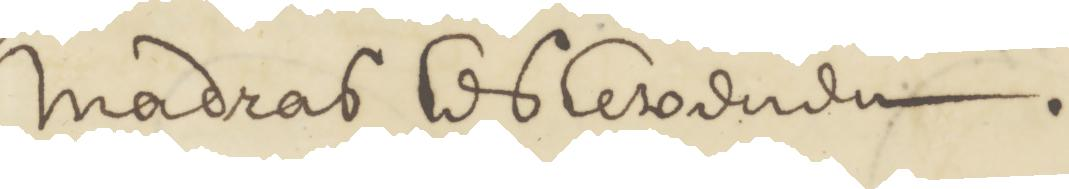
madras te stevenen.
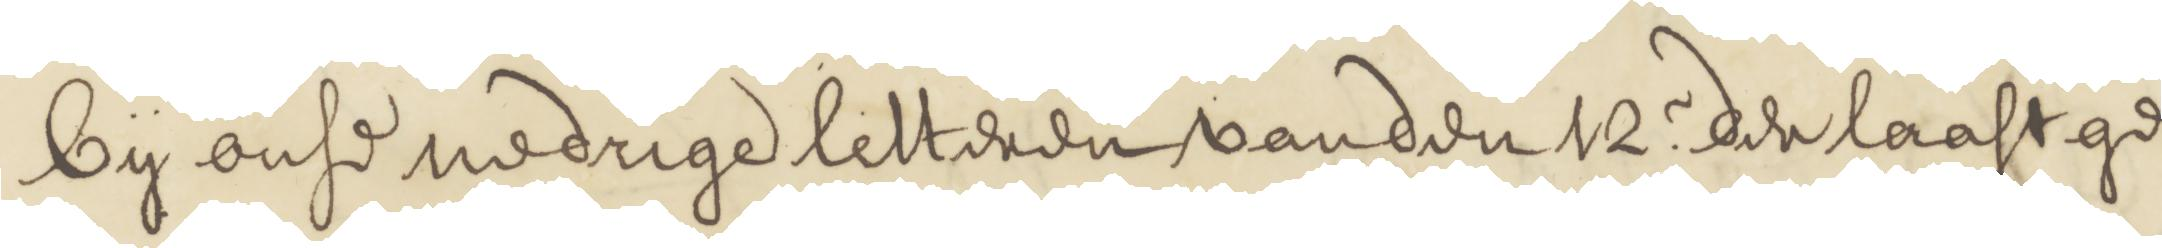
bij onse nedrige letteren van den 12.' der laast ge
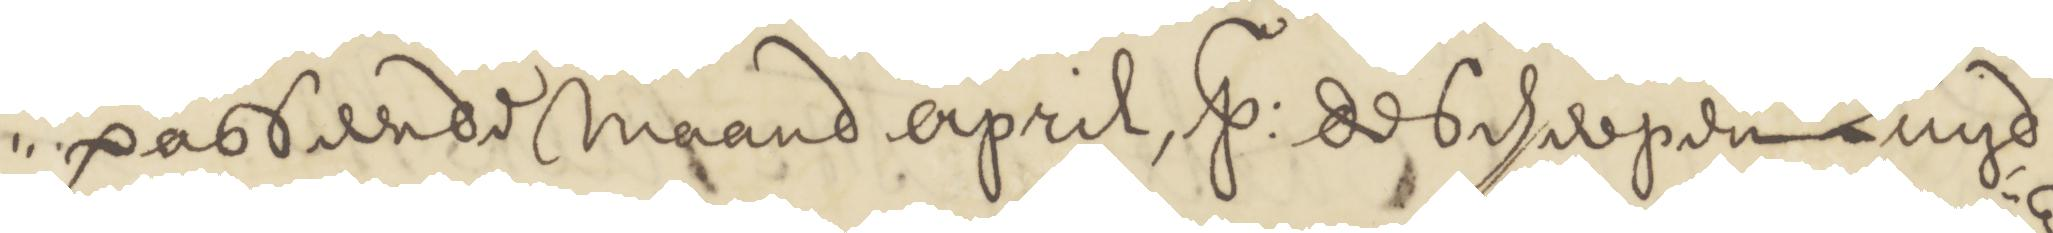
„passeerde maand april, p:r de scheepen zuyd
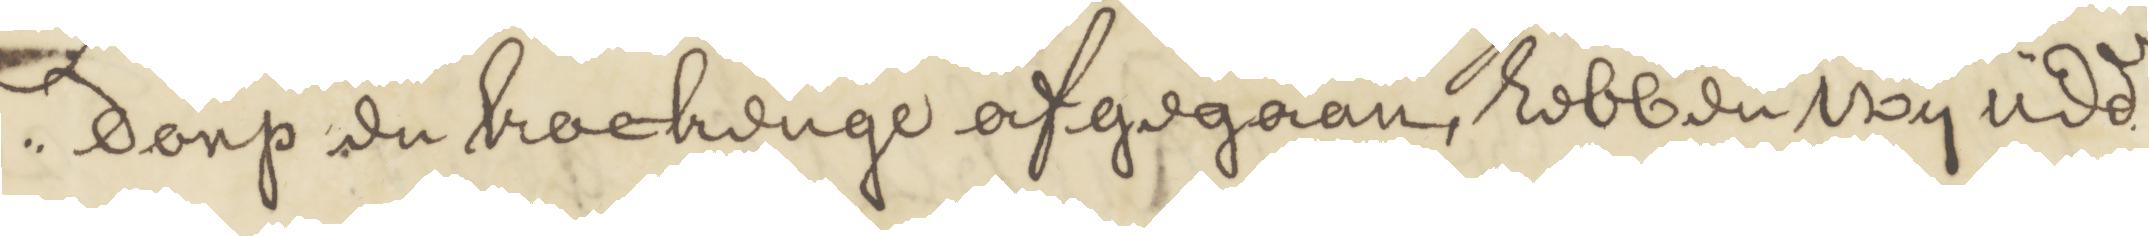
„dorp en kockenge afgegaan, hebben wij uEd.
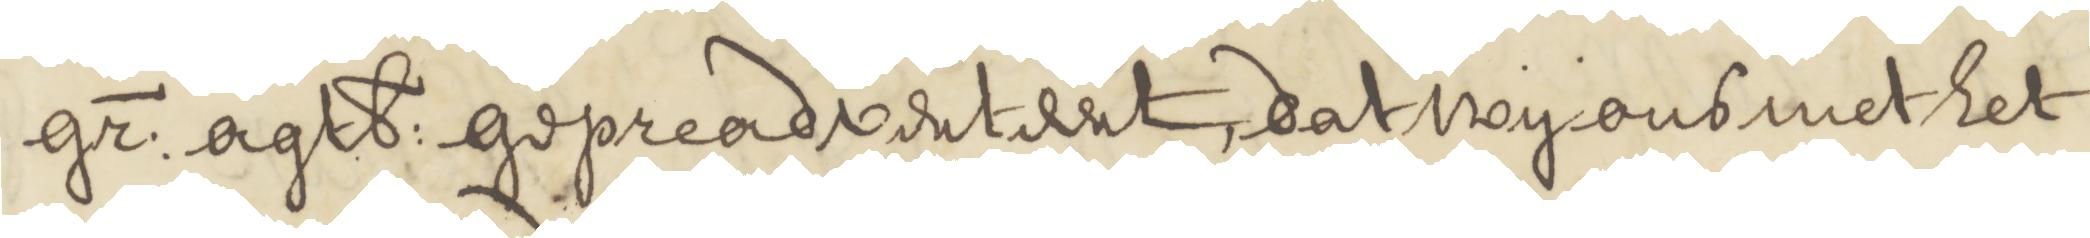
gr: agtb: gepreadverteert, dat wij ons met het
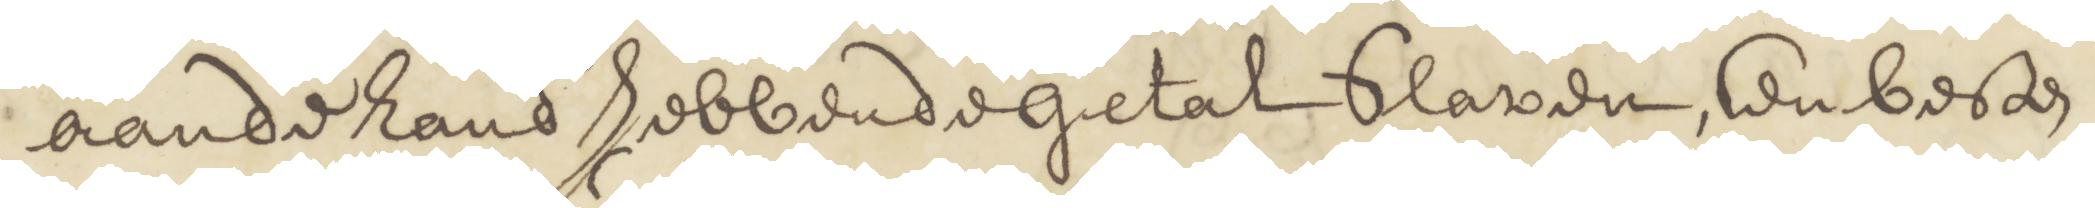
aande hand hebbende getal slaven, ten besten
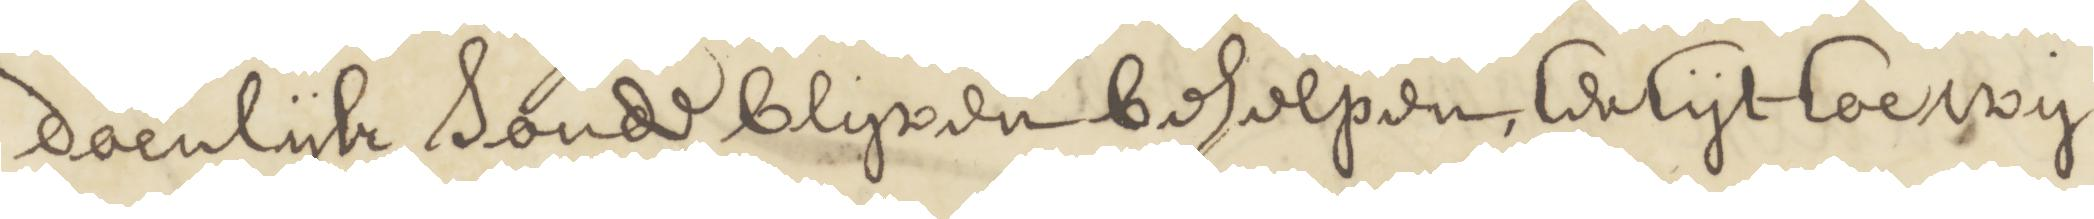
doenlijk soude blijven behelpen, ter tijt toe wij
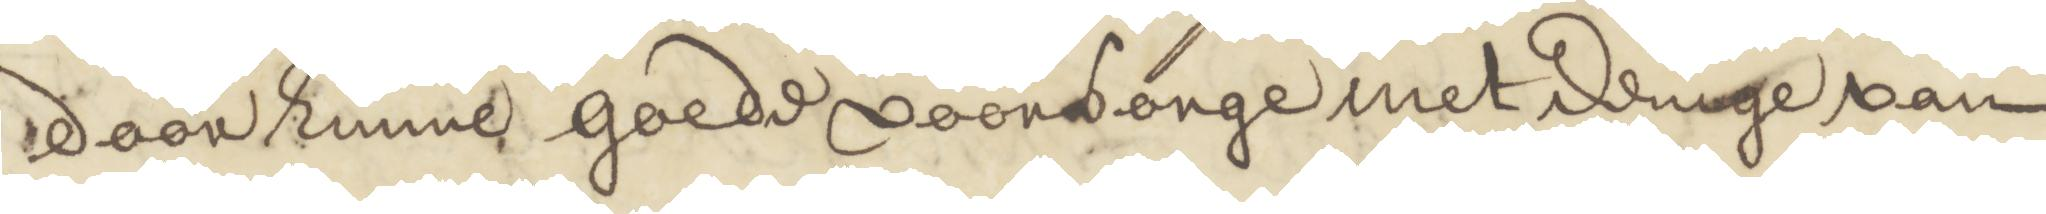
door hunne goede voorsorge met Eenige van
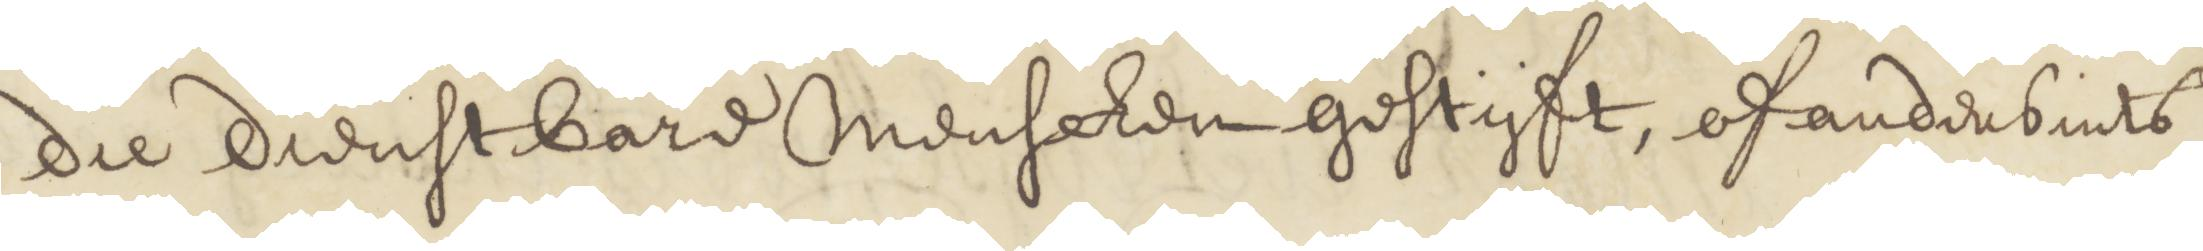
die dienstbare menschen gestijft, of andersints
